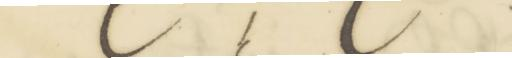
C,un C
